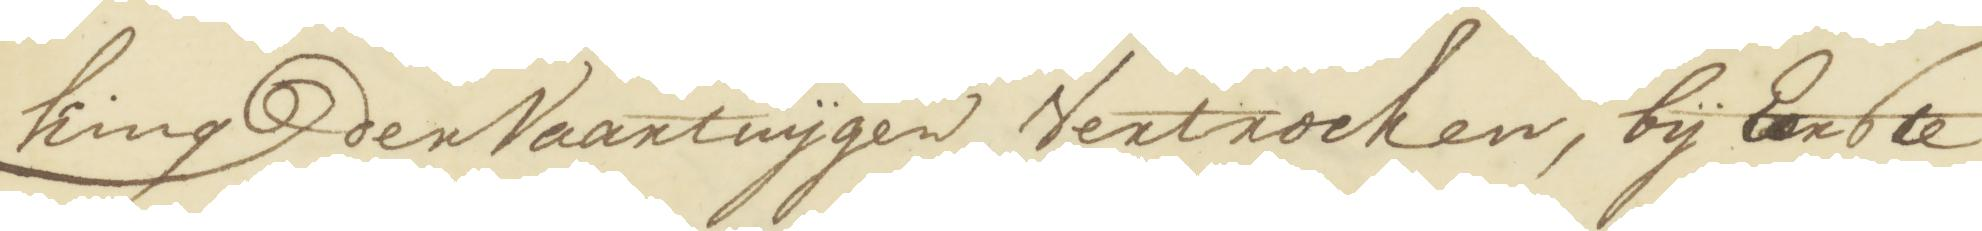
king der Vaartuijgen Vertrocken, bij Eerste
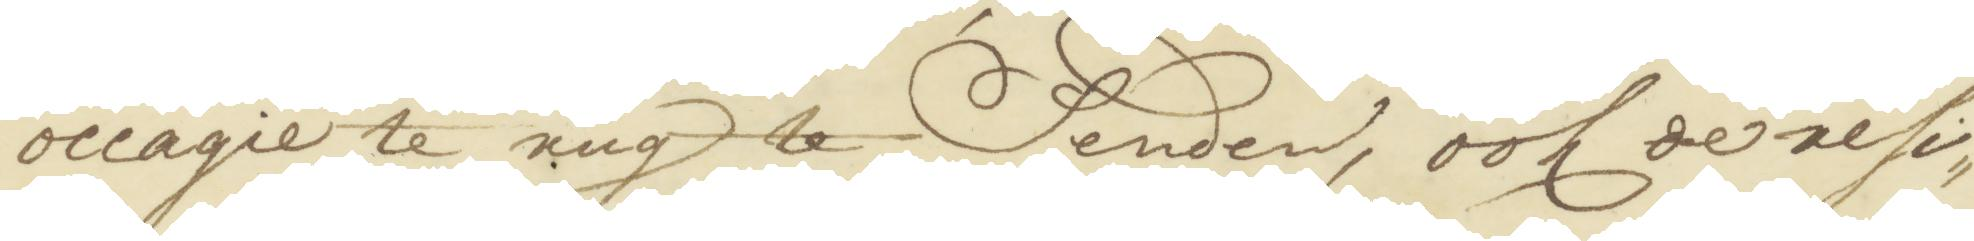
occagie te rug te senden, ook de resi„
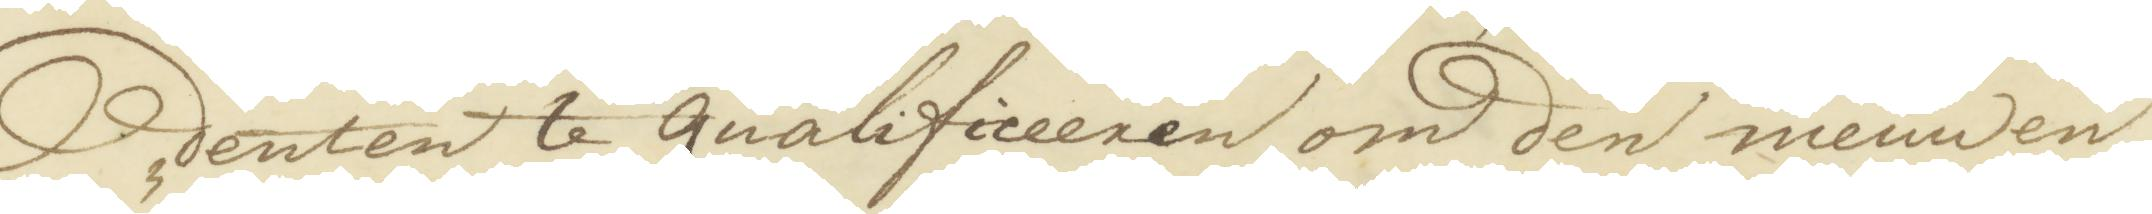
denten te qualificeeren om den nieuwen
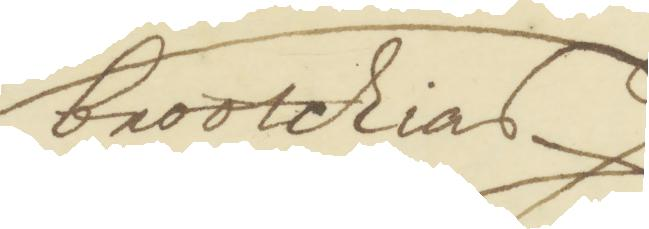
brootchias—
